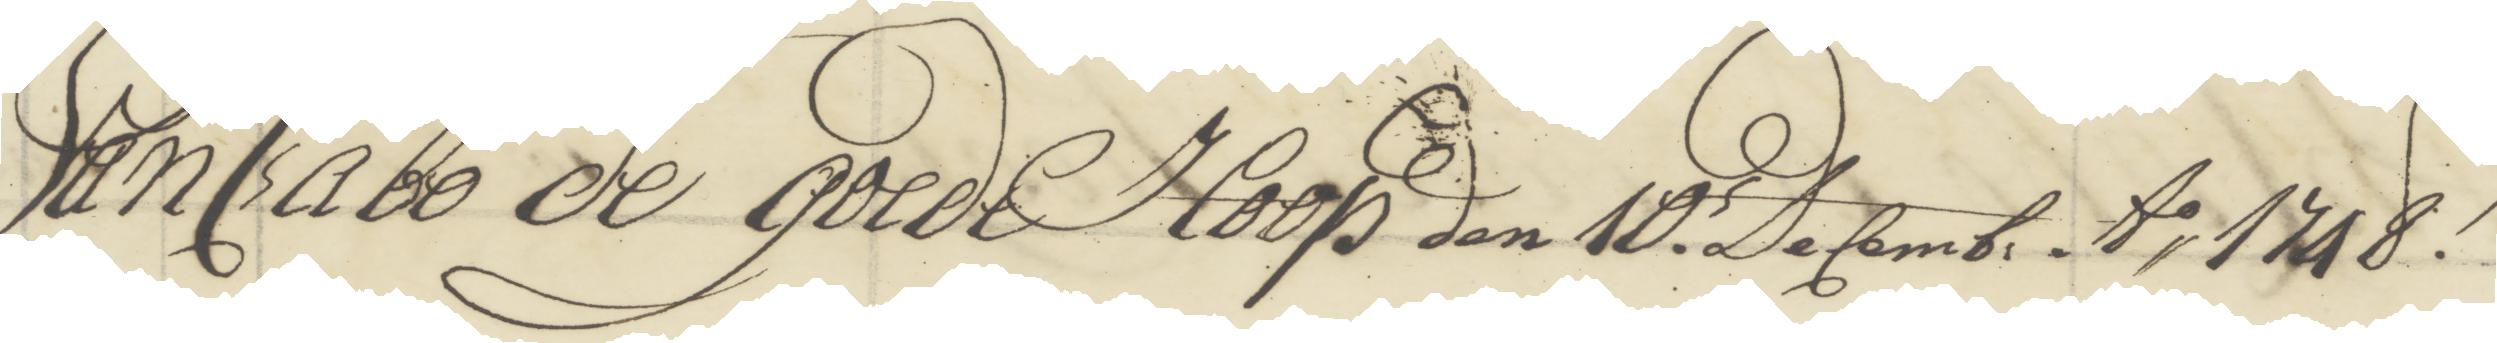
Van Cabo de goede Hoop den 10.' Decemb: A„o 1748!
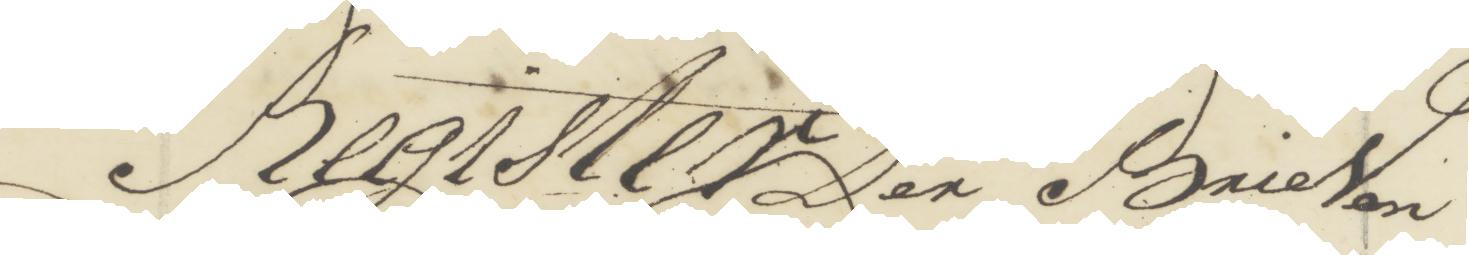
Register Der Brieven
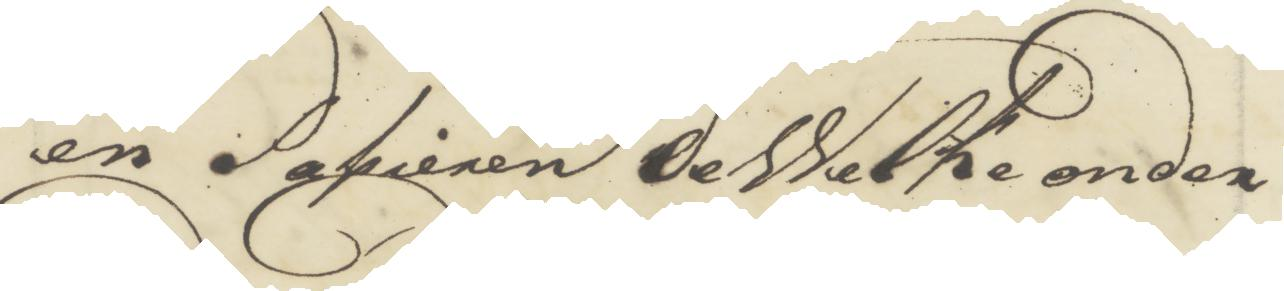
en Papieren de welke onder
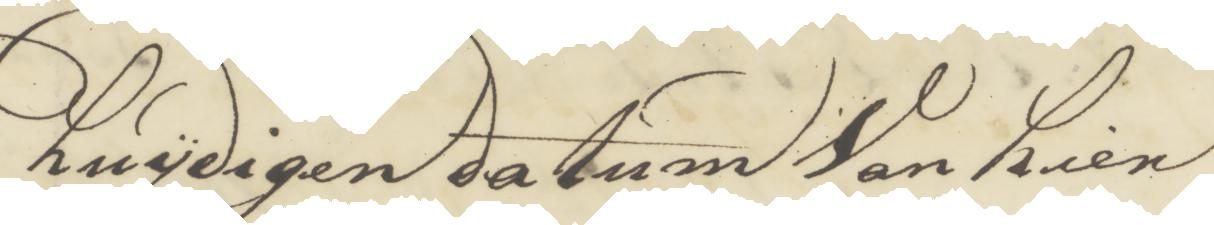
huijdigen datum van hier
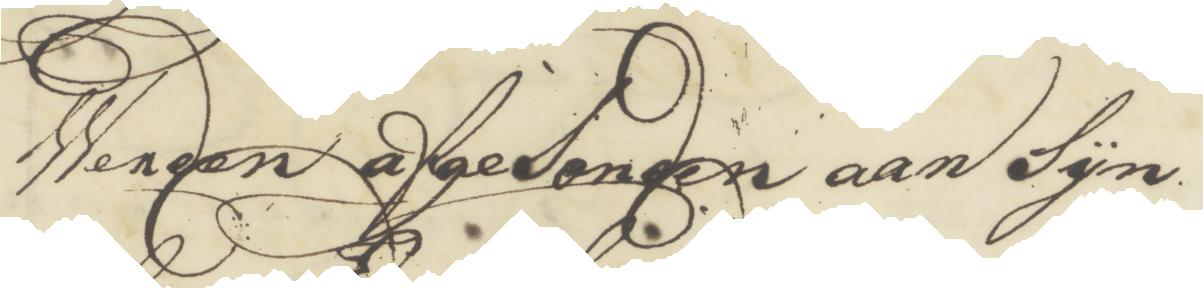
werden afgesonden aan sijn
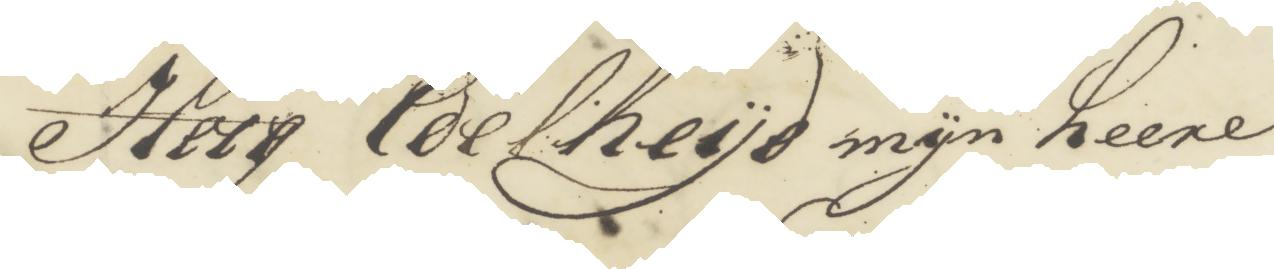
Hoog Edelheijd mijn heere
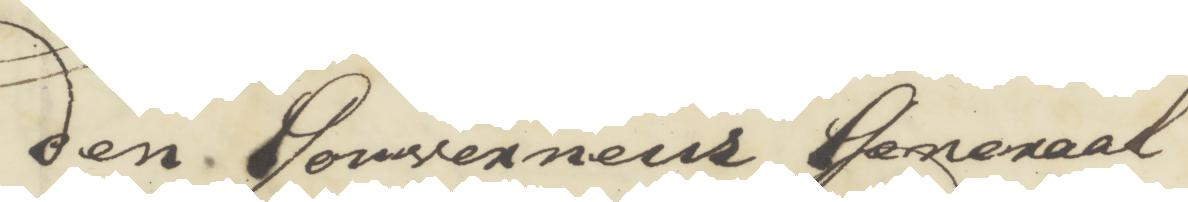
den Gouverneur Generaal
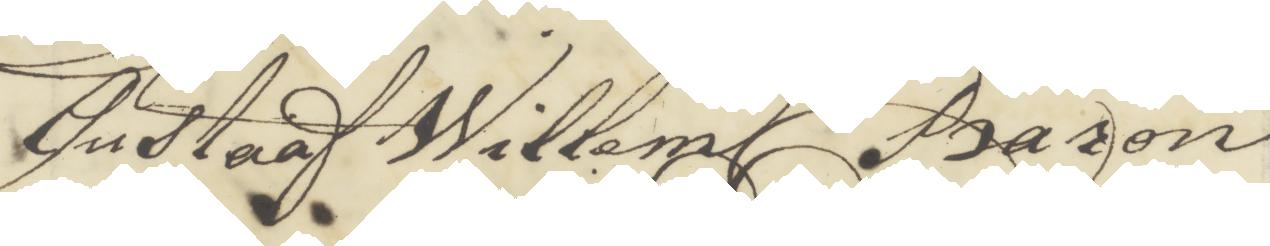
Gustaaf Willem Baron
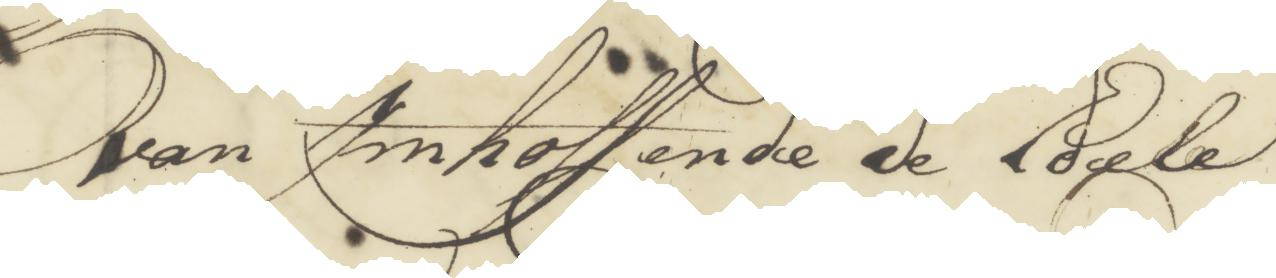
van Imhoff ende de Edele
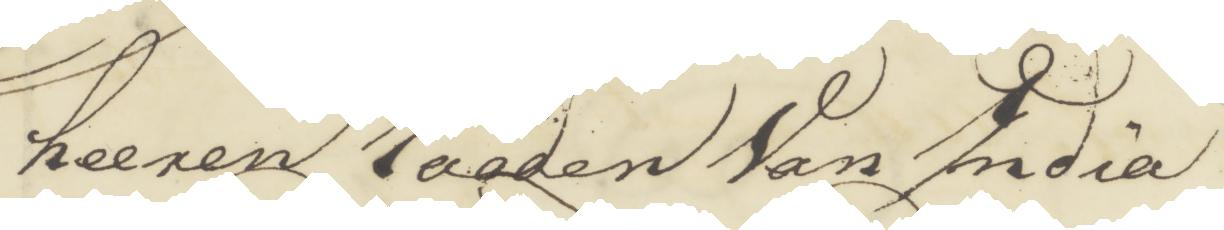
heeren raaden van Jndia
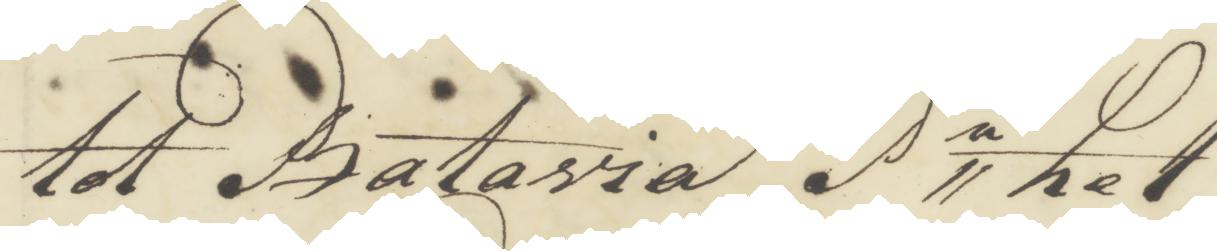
tot Batavia P„r het
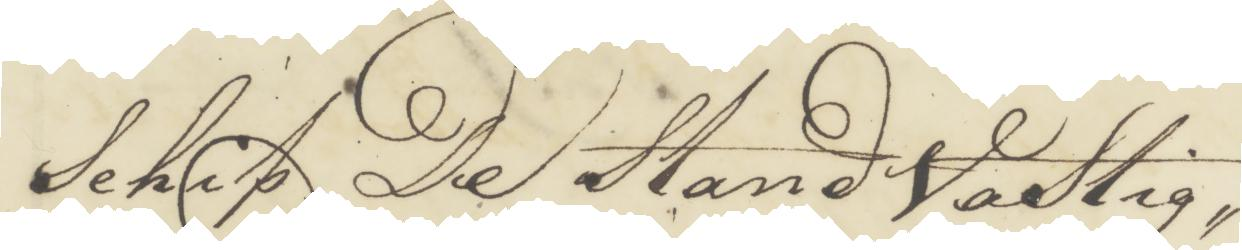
schip De standvastig„
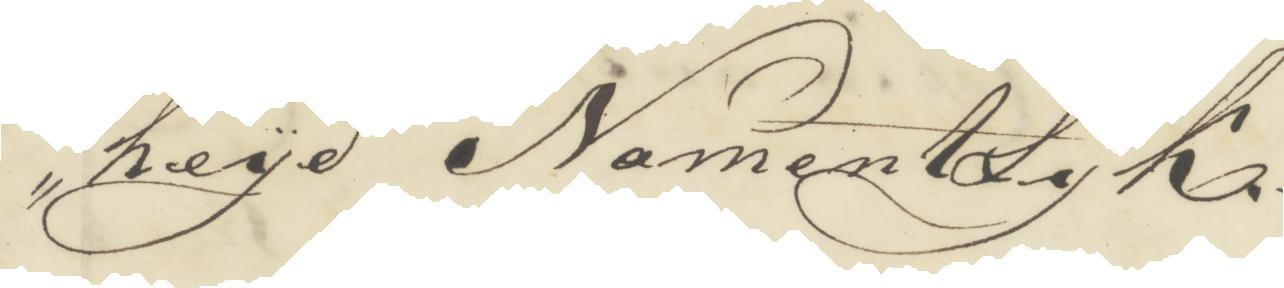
„heijd Namentlijk.
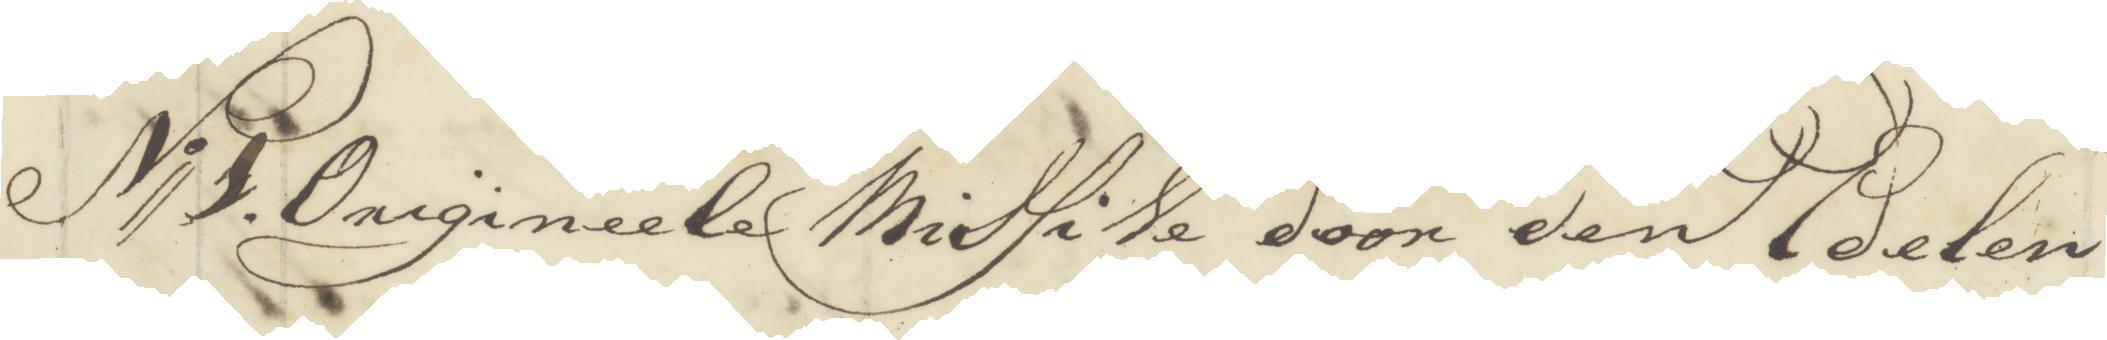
N„o 1. Origineele missive door den Edelen
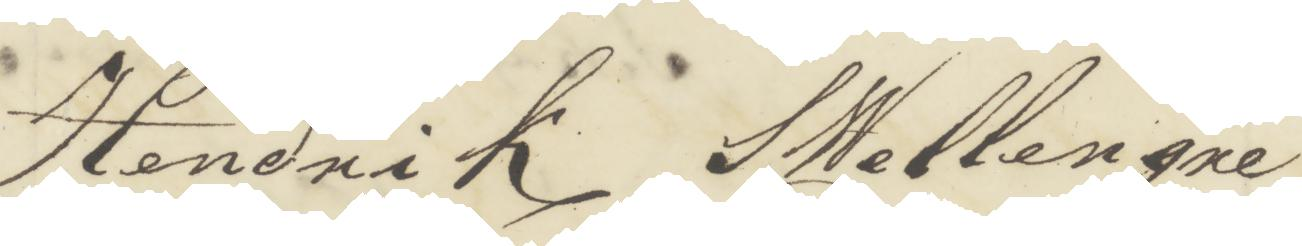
Hendrik Swellengre
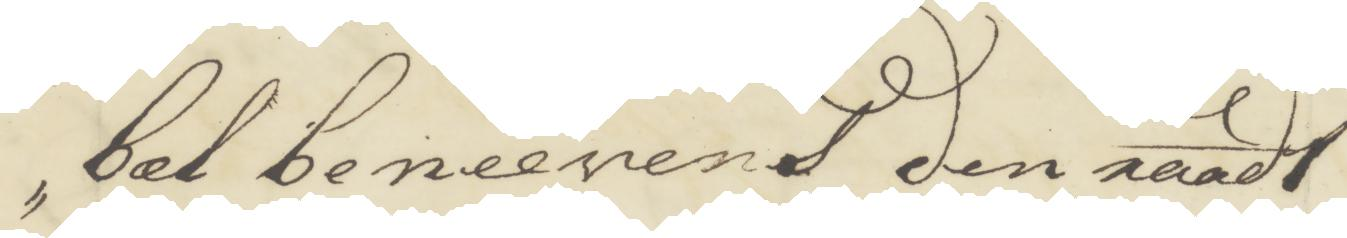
„bel beneevens den raadt
